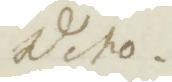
Dito . . . . . . .
